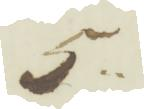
5 „ —
